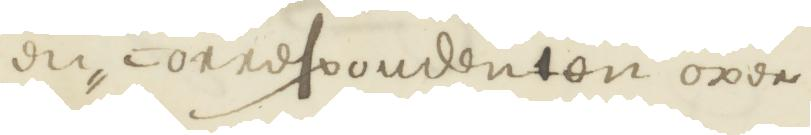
en„ correspondenten over
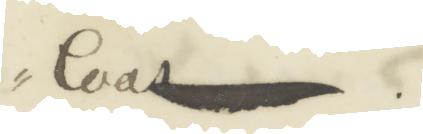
„laat
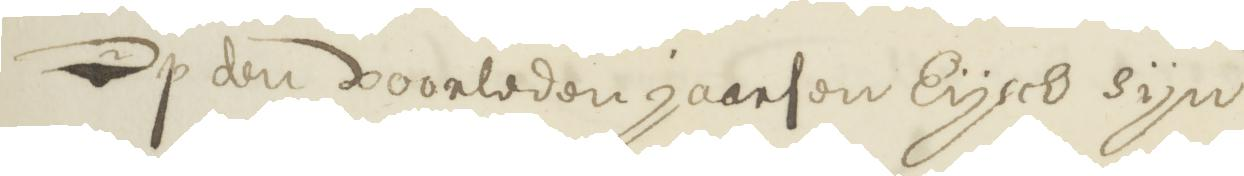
Op den voorleden jaarsen Eijsch sijn
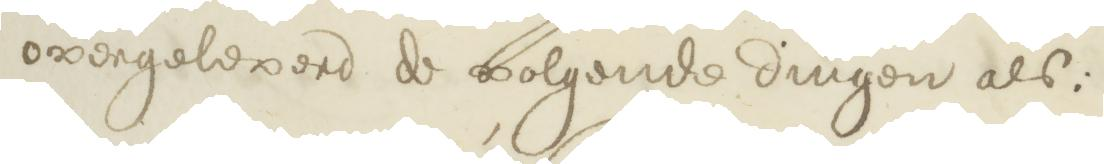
overgeleverd de volgende dingen als:
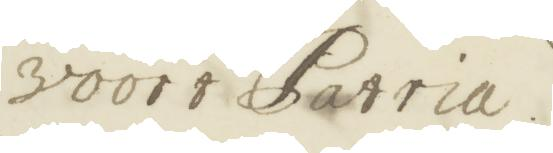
voor 't Patria
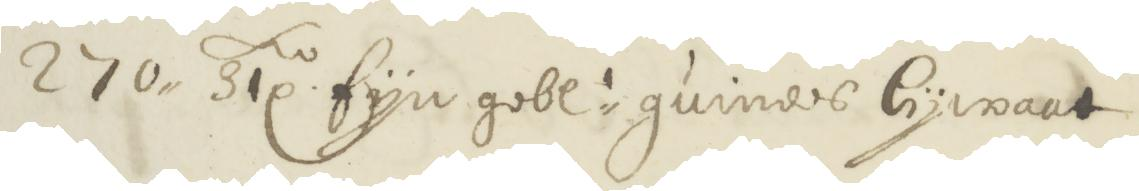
270„ stx:e fijn gebl„t guinees lijwaat
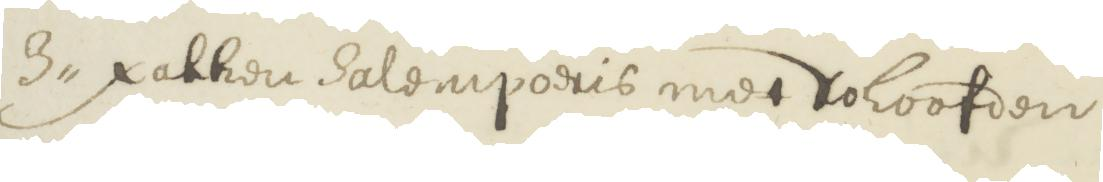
3„ pakken salempoeris met ro hoofden
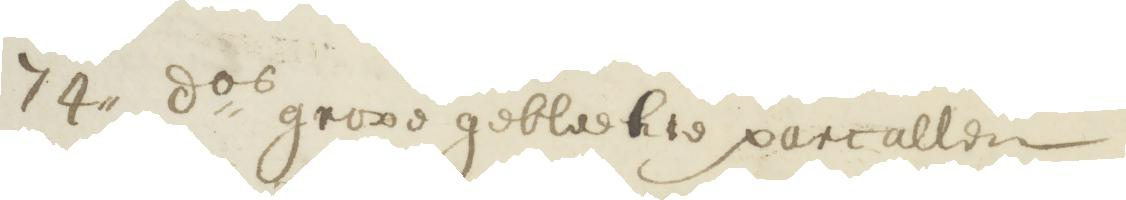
74„ d„os grove gebleekte parcallen
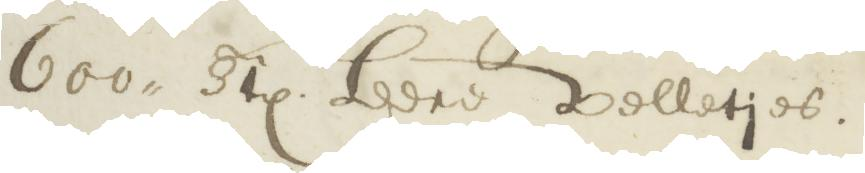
600„ stx. Leere velletjes.
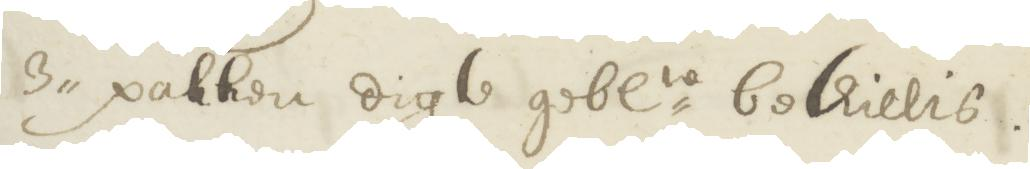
3„ pakken digte gebl„te bethillis.
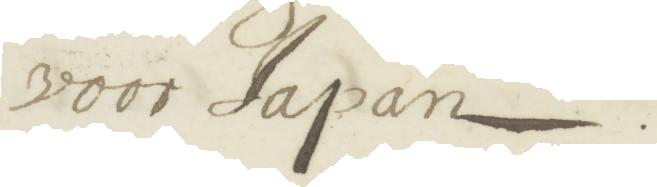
voor Iapan.
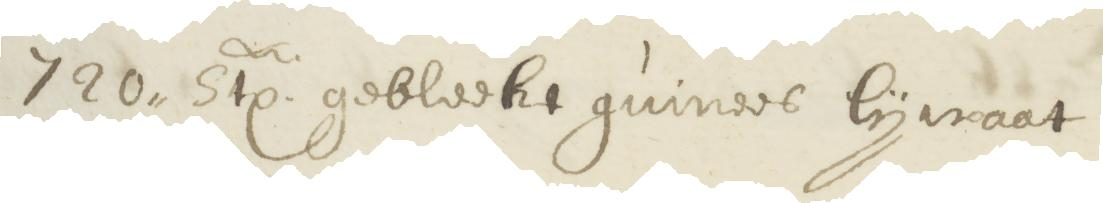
720„ stx: gebleekt guinees lijwaat
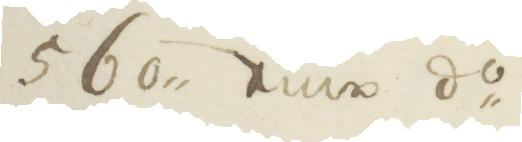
560„ ruw d„o
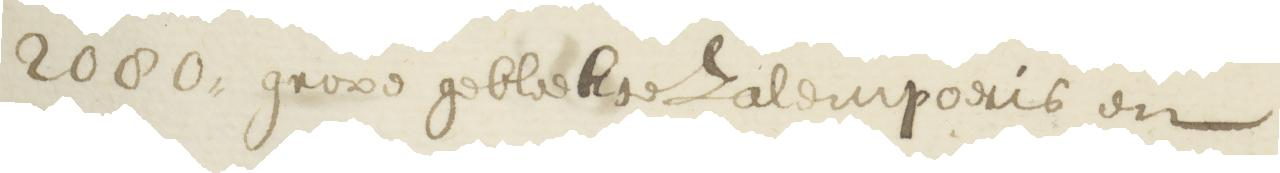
2080„ grove gebleekte Zalempoeris en
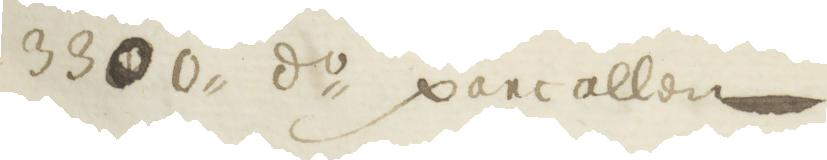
3300„ d„o parcallen
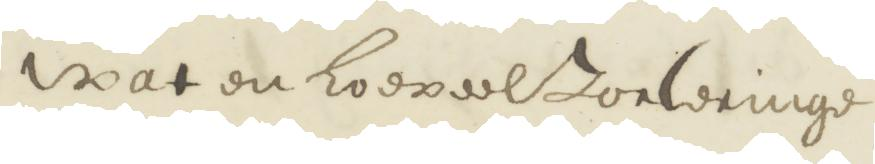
wat en hoeveel Zorteringe
